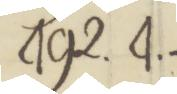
492.4.—.
